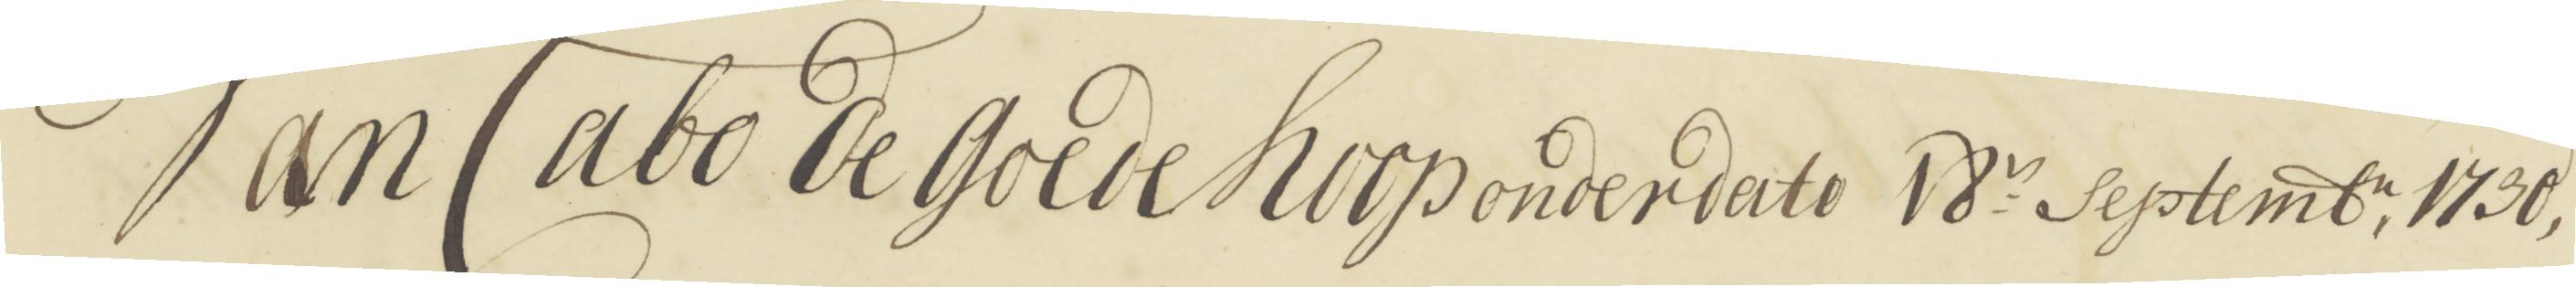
Van Cabo de goede hoop onder dato 18=e septemb„r 1730,
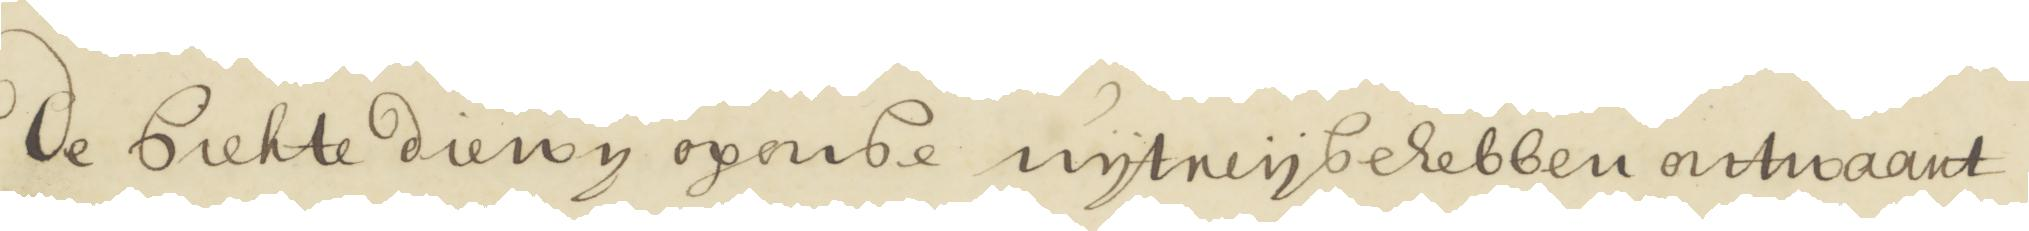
de siekte die wij op onse uijtreijse hebben ontwaart
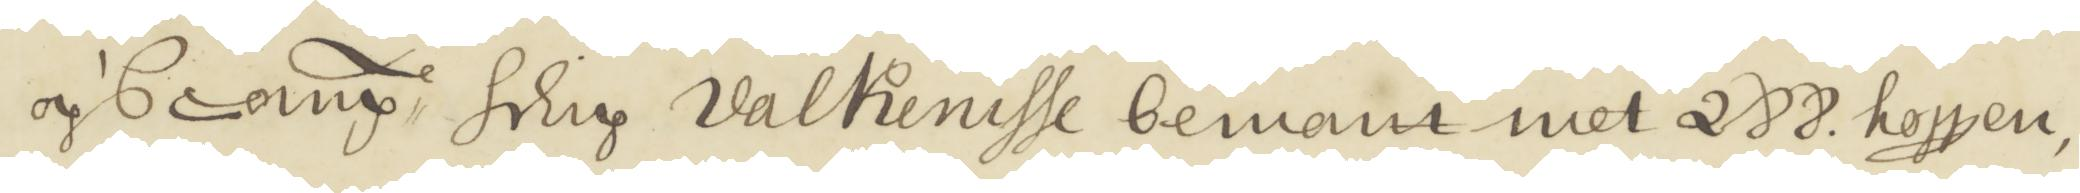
op 's comp„e schip valkenisse bemant met 288. koppen,
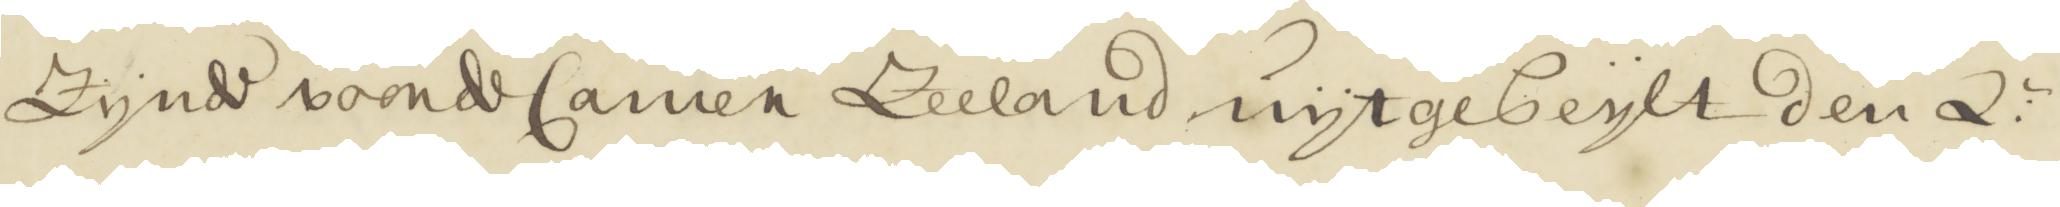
zijnde voor de Camer Zeeland uijtgeseijlt den 2:'
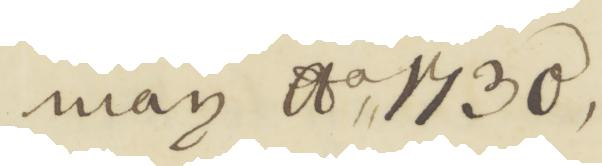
maij a„o 1730,
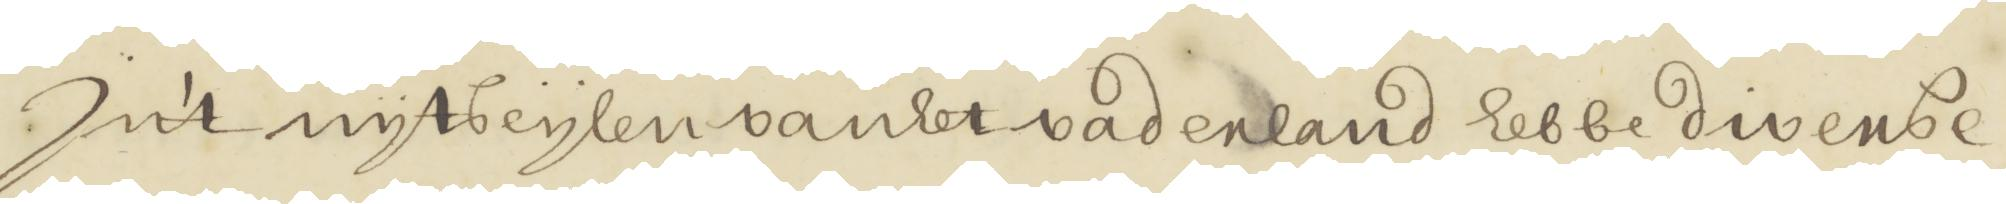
jn’t uijtseijlen van het vaderland hebbe diverse
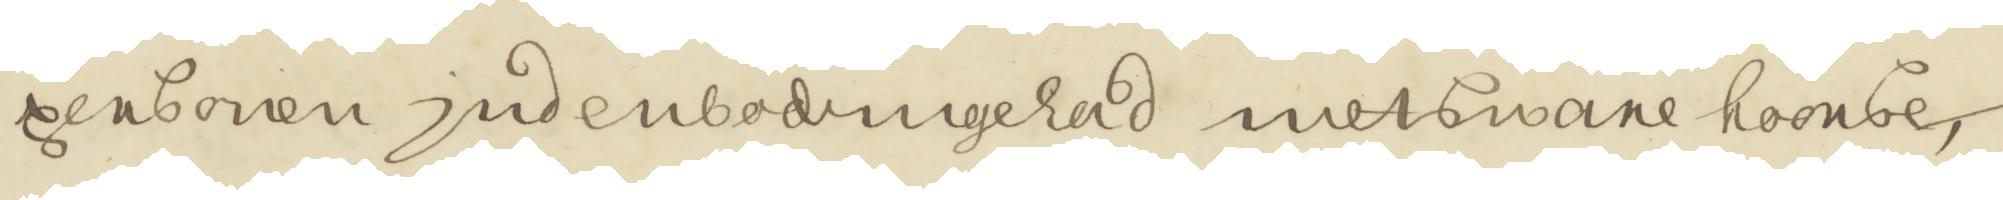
personen jnden bodemgehad met sware koorse,
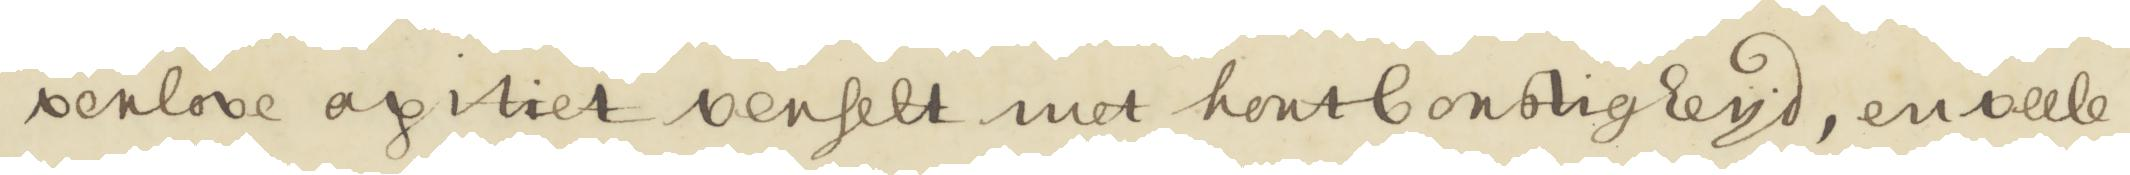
verlove apitiet verselt met kortborstigheijd, en veele
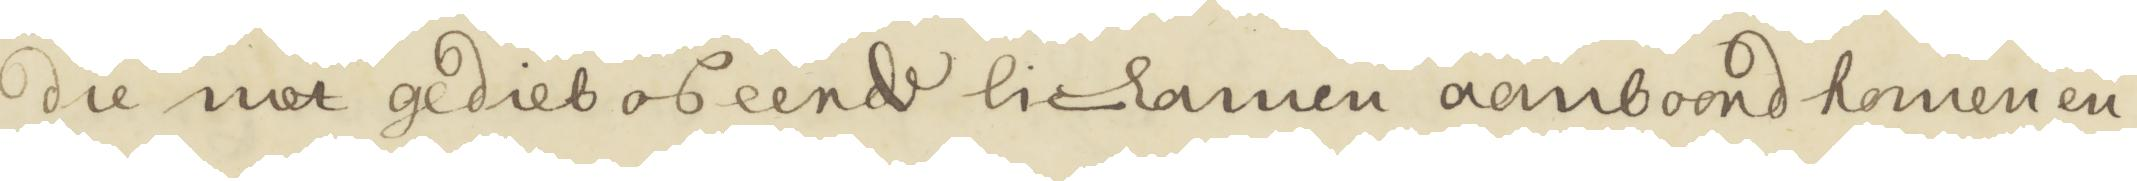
die met gedieboseerde lichamen aanboord komen en
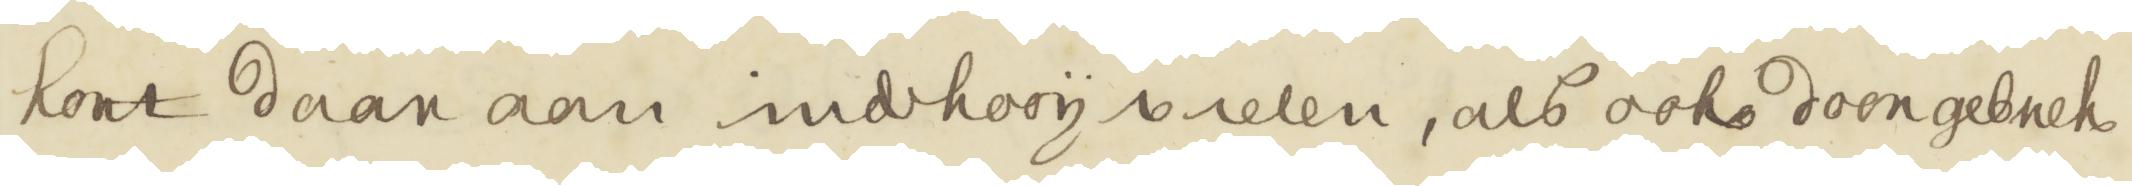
kort daar aan indekooij vielen, als ook door gebrek
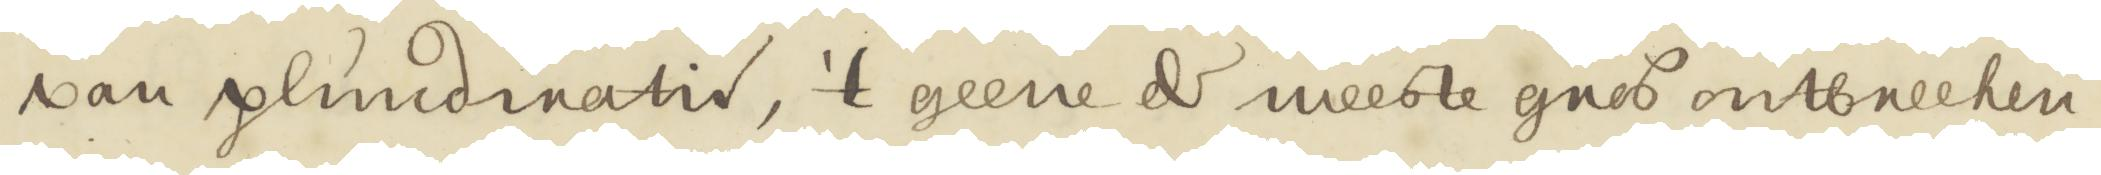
van plundiratie, ’t geene de meeste gros ontbreeken
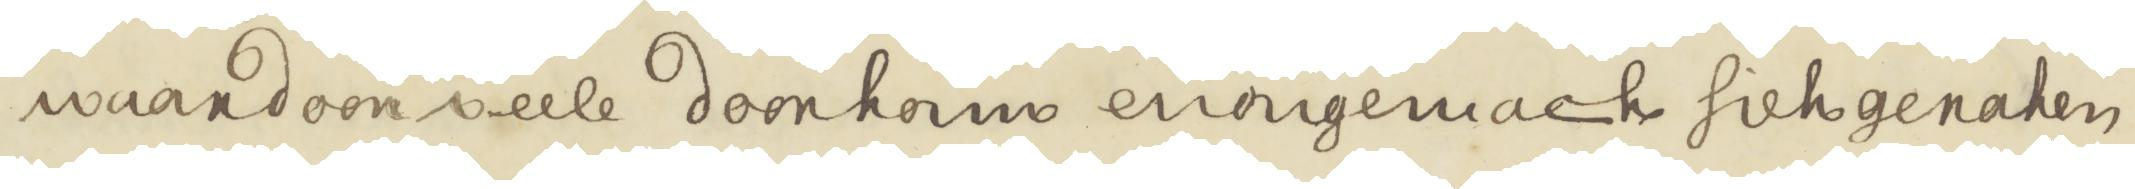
waardoor veele doorkouw en ongemack siek geraken
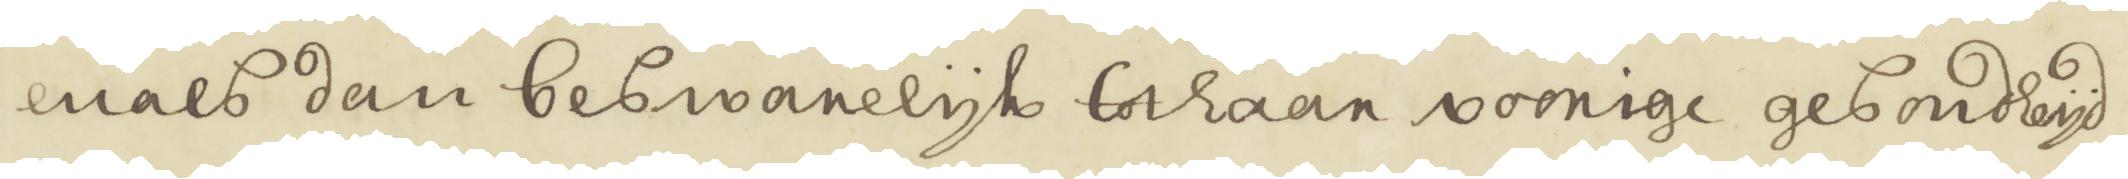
en als dan beswarelijk tot haar voorige gesondheijd
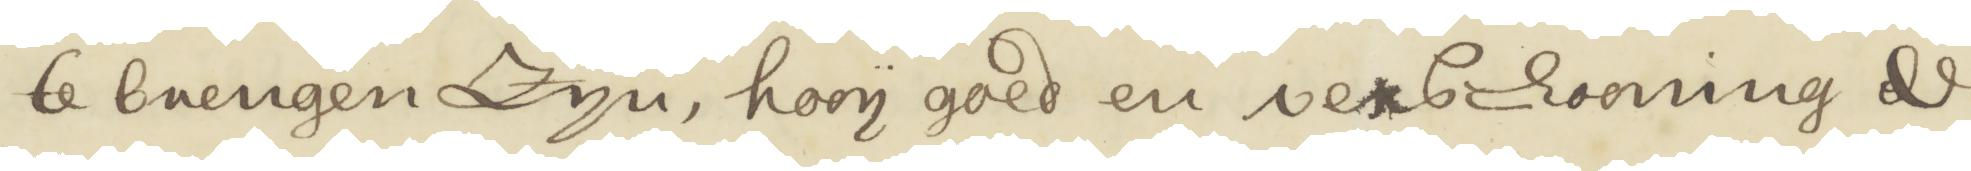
te brengen zijn, hooij goed en verschooning de
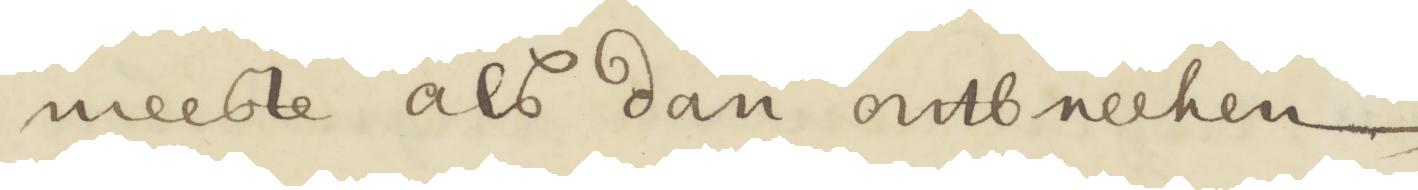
meeste als dan ontbreeken
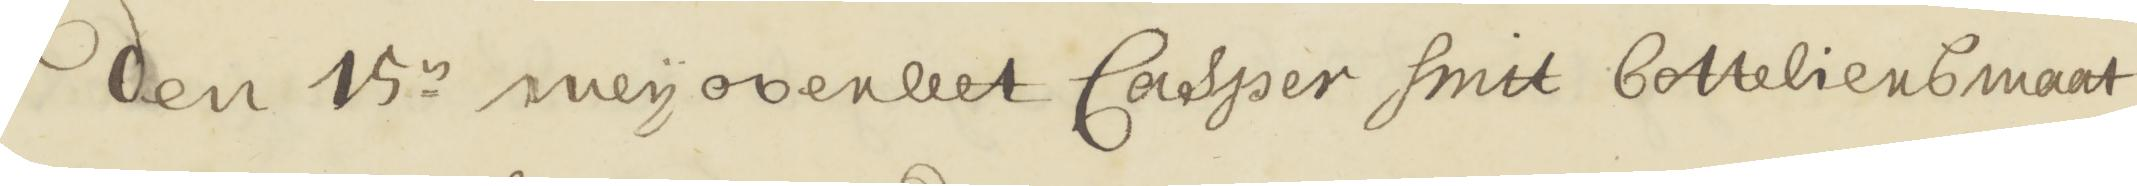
den 15=e meij overleet Casper smit botteliersmaat
